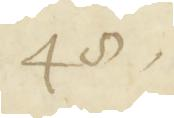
48,
